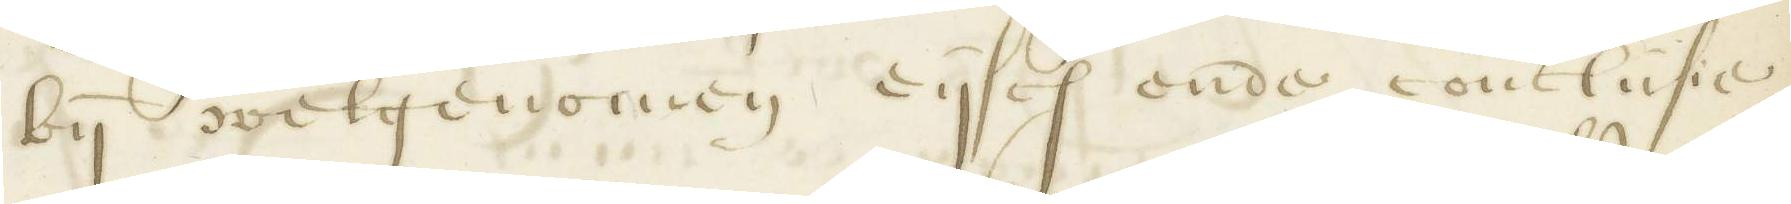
bij welgenomen eijsch ende conclusie
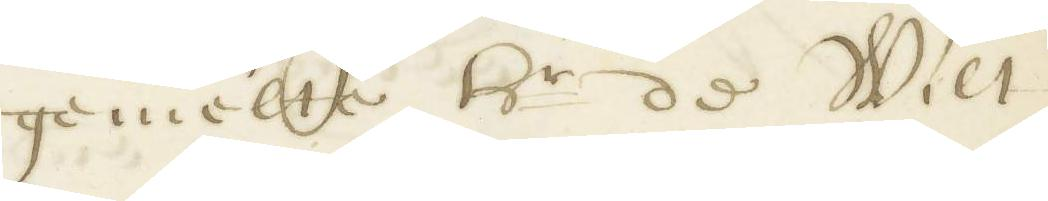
gemelte H=r de Wilt
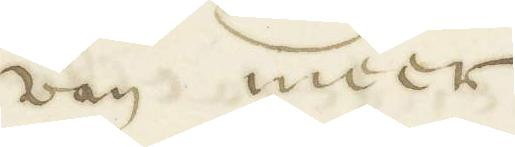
van meer
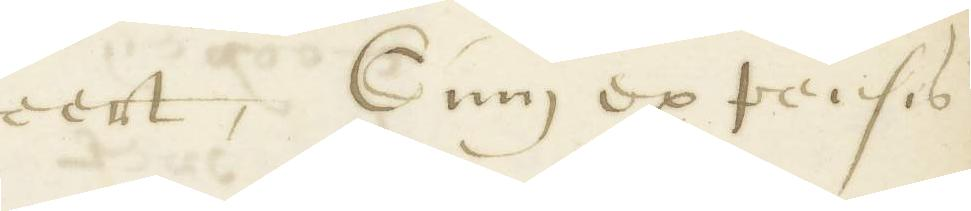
eert, Cum expensis
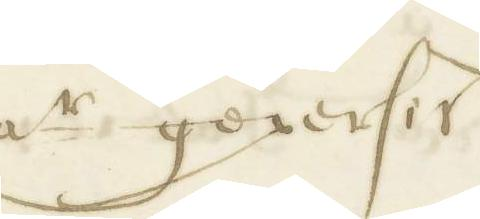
Za=r gepersis
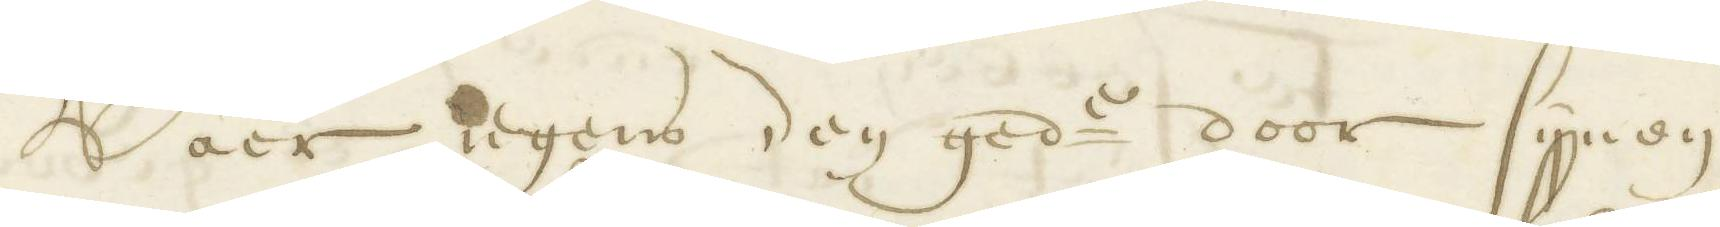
Waer tegens den ged=e door sijnen
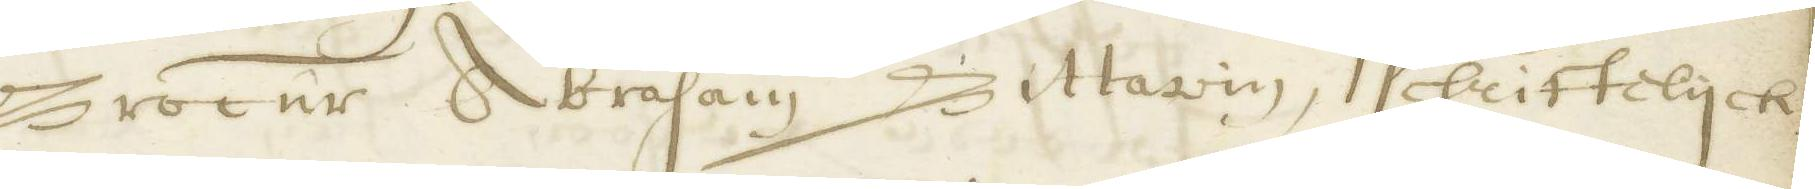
Procur Abraham Pittavin, schriftelijck
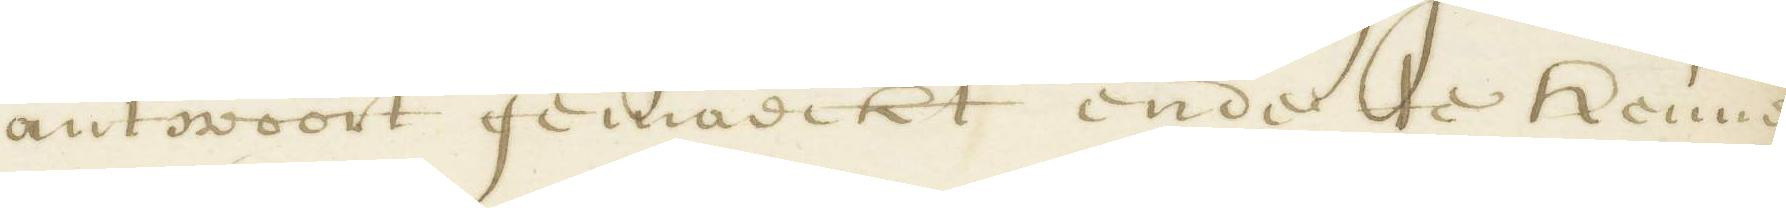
antwoort gemaeckt ende te konnen
